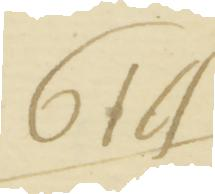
614
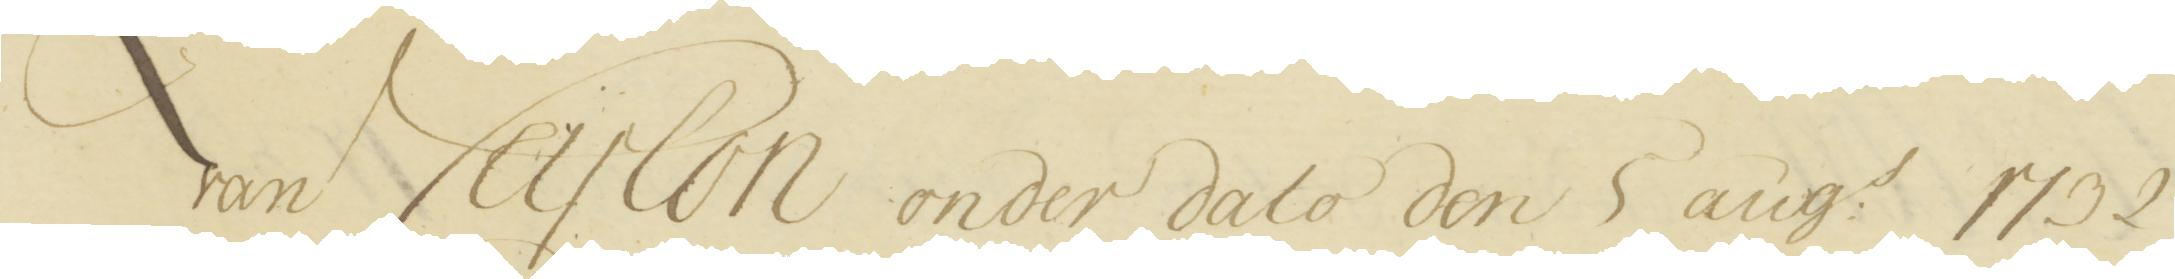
Van Ceijlon onder dato den 5' aug:s 1732
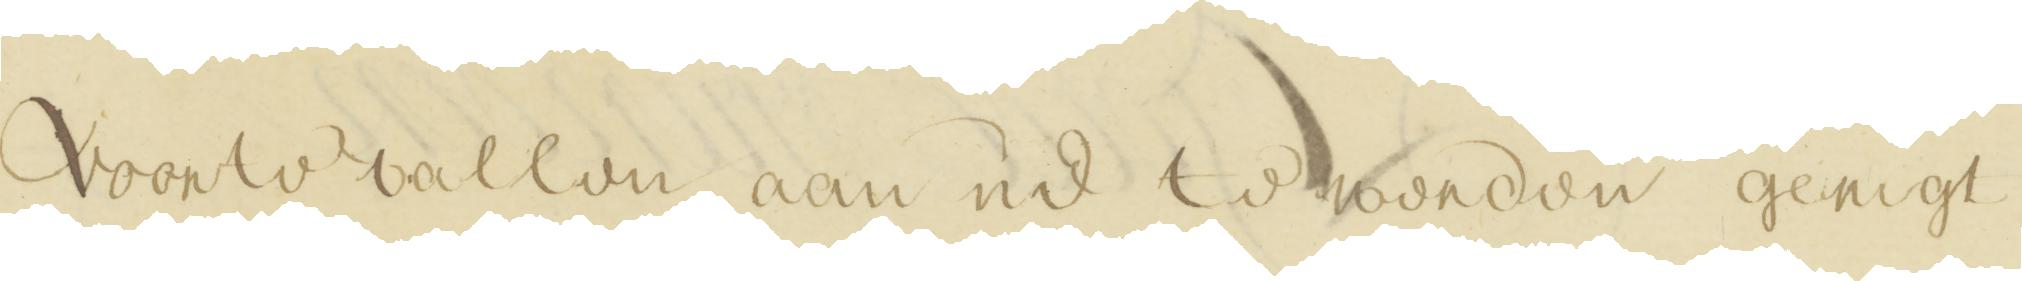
voor te vallen aan uE te werden gerigt
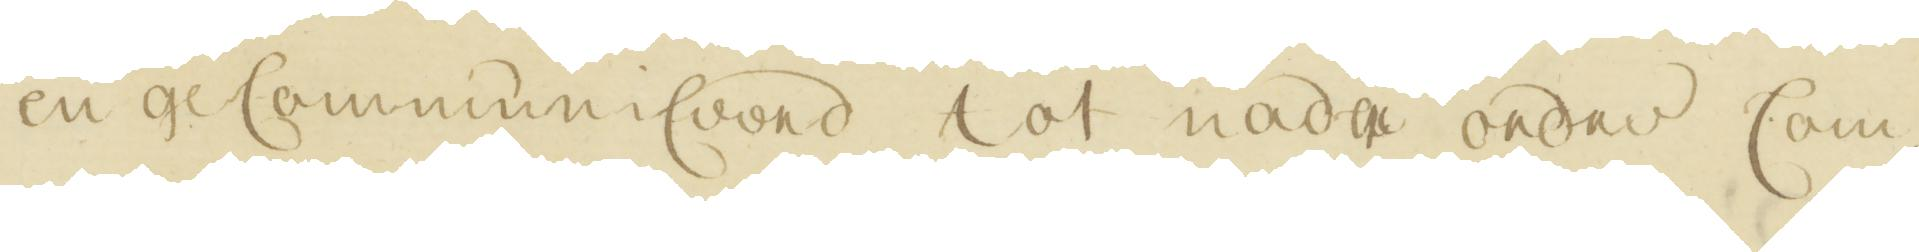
en gecommuniceerd tot nada ordre Com„
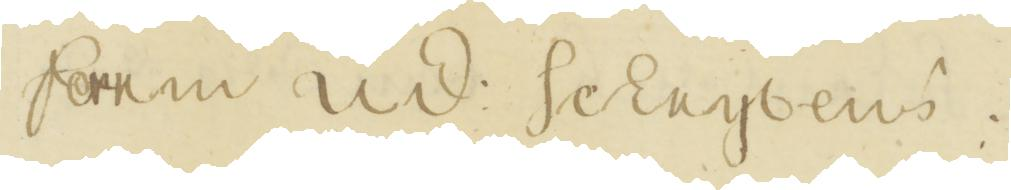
form UE: Schryvens:
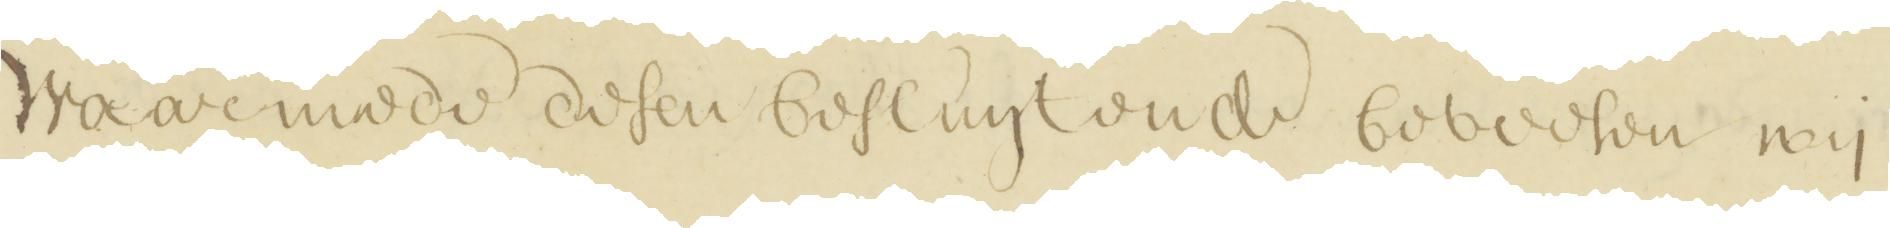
Waarmede desen besluytende beveelen wij
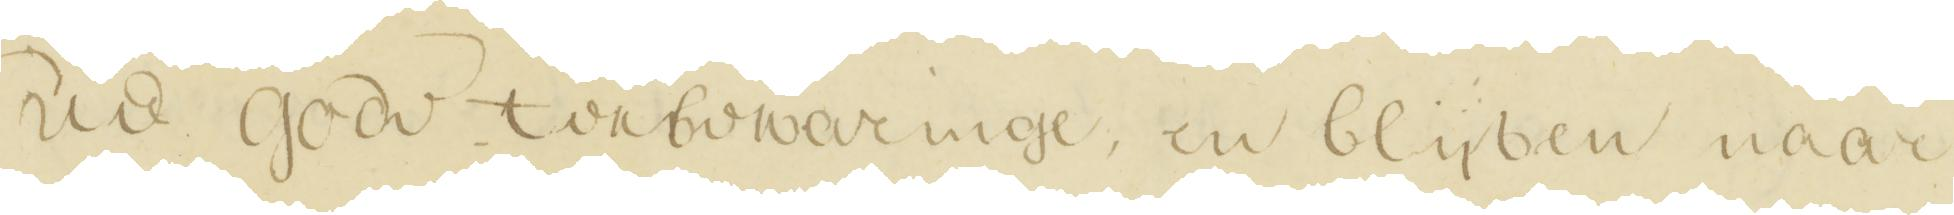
uE: gode ter bewaringe, en blijven naar
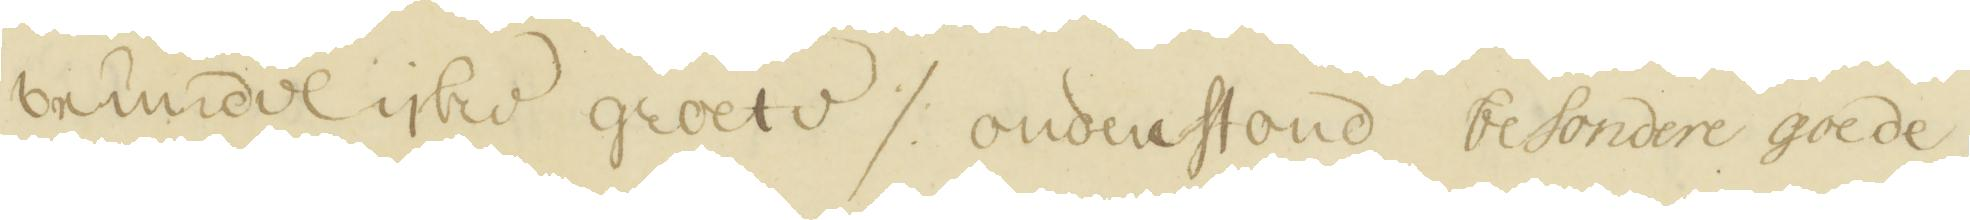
vrundelijke groete /: onderstond besondere goede
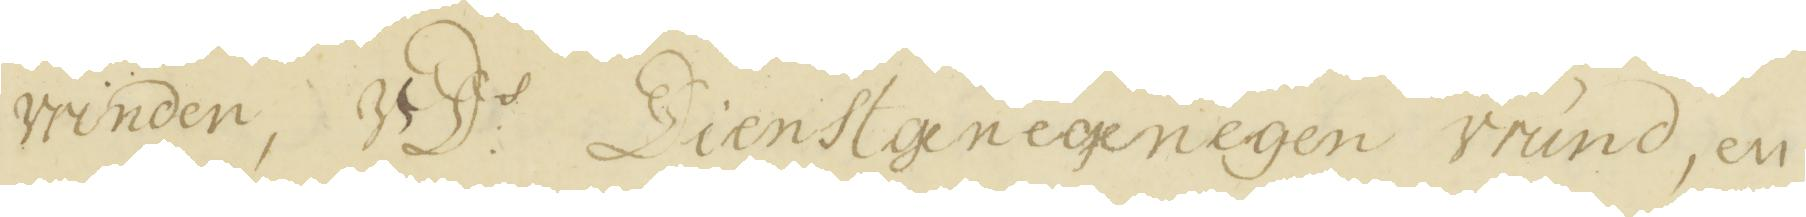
vrinden, VE:s Dienstgenegen egen vrund, en
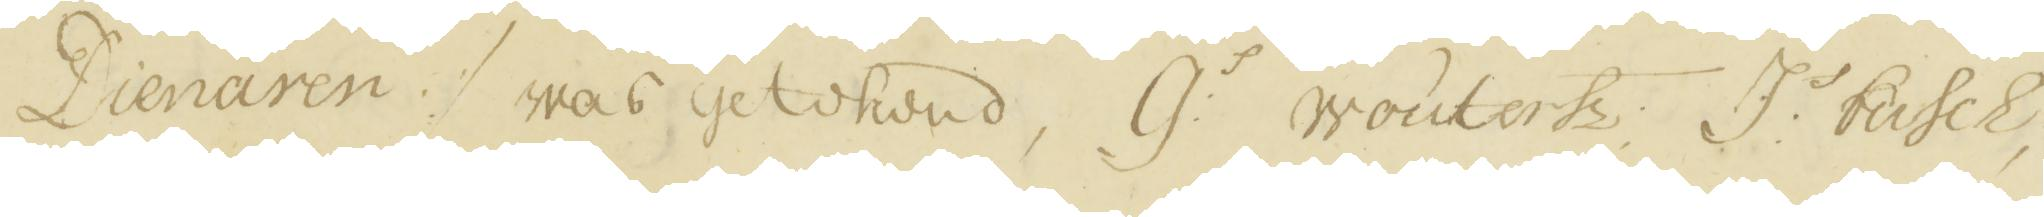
Dienaren :/ was getekend, G:s woutersz: I:s busch„
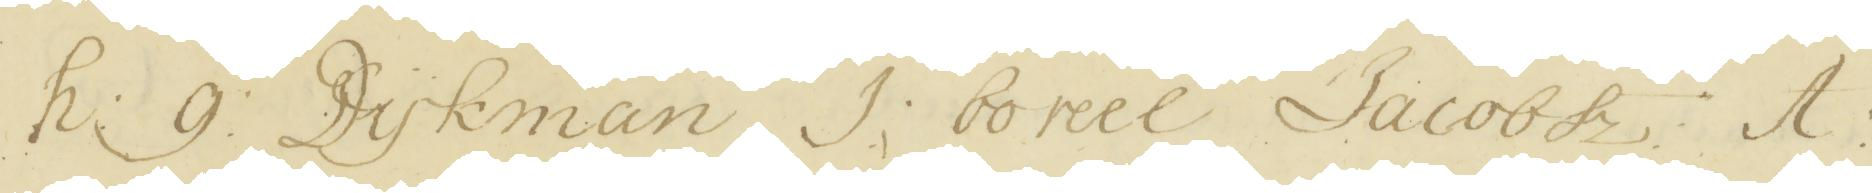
h: g: Dijkman I: boreel Iacobsz: A:
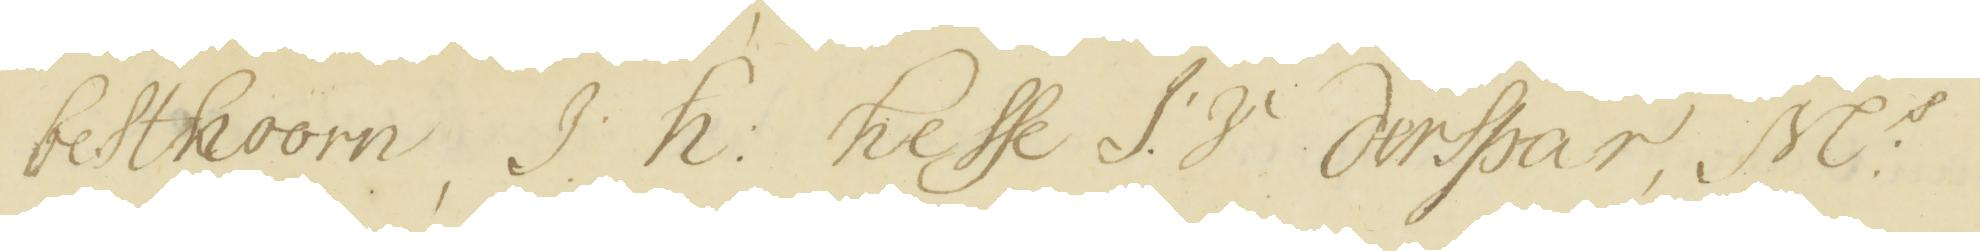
besthoorn I: h: hesse I: V: der Spar, M:s
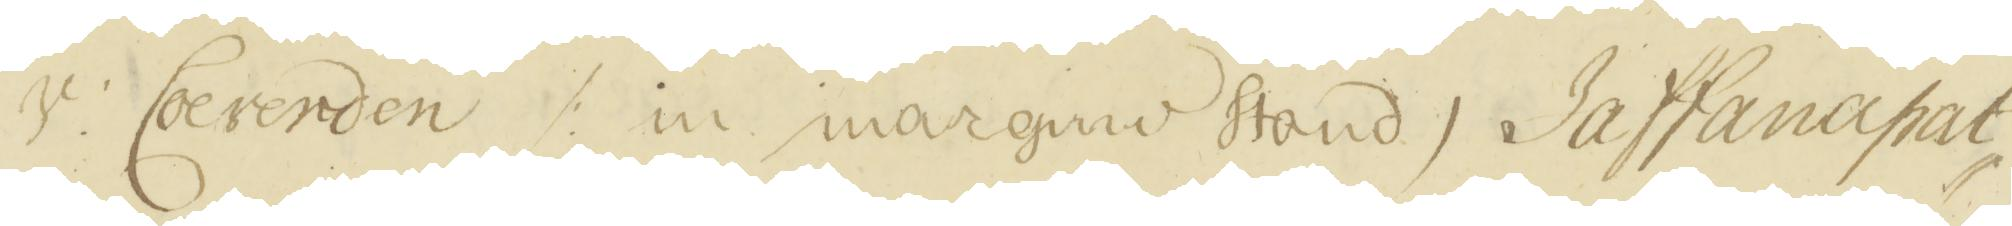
v: Coeverden /: in margine stond:/ Iaffanapat„
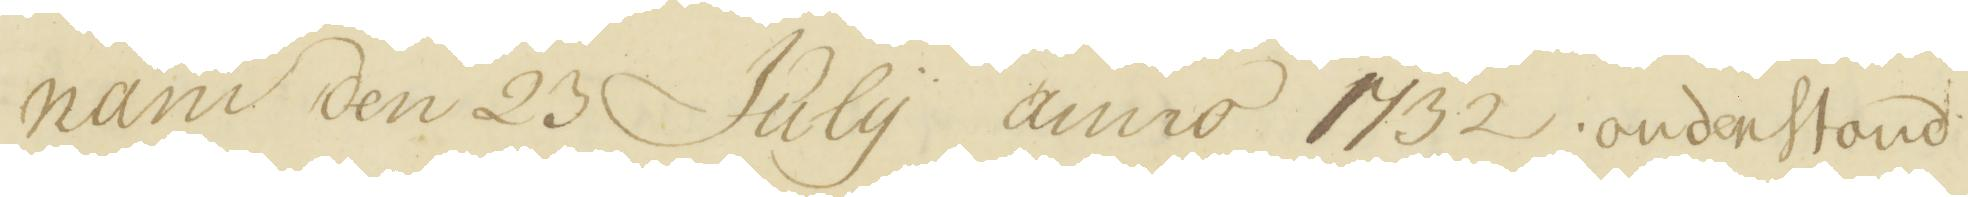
nam den 23 Iulij anno 1732. onderstond
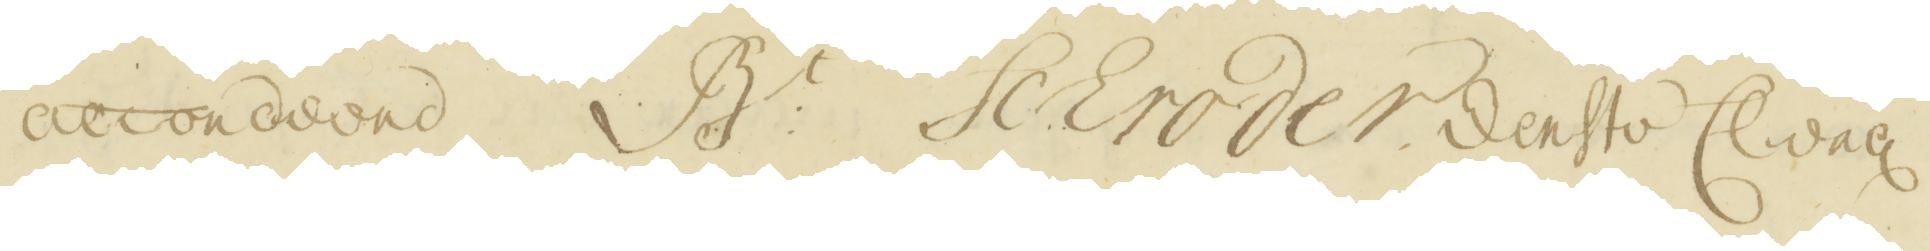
accordeerd B:t Schroder Eerste Clerq
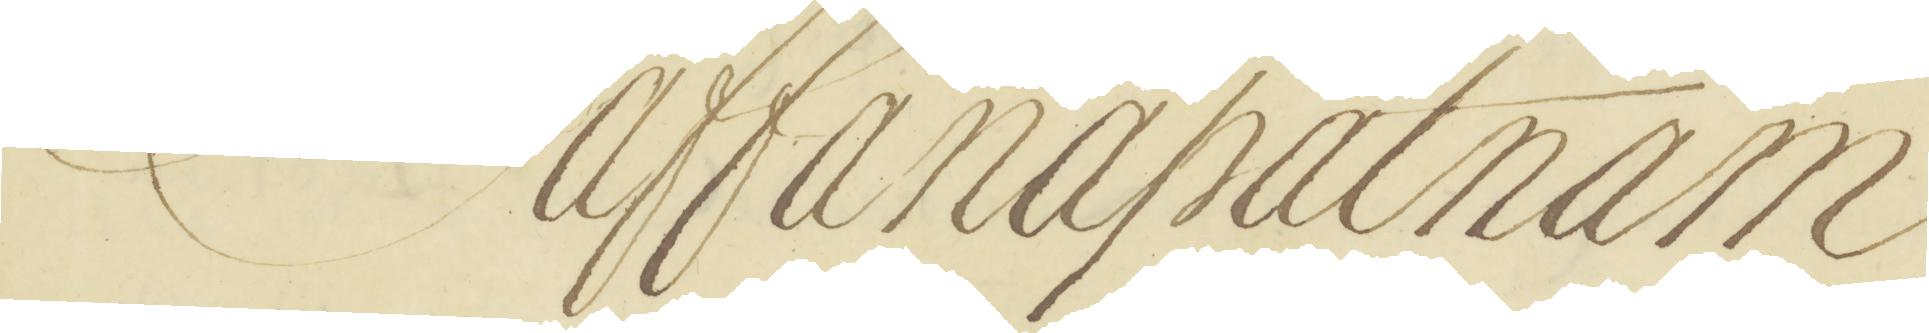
Jaffanapatnam
